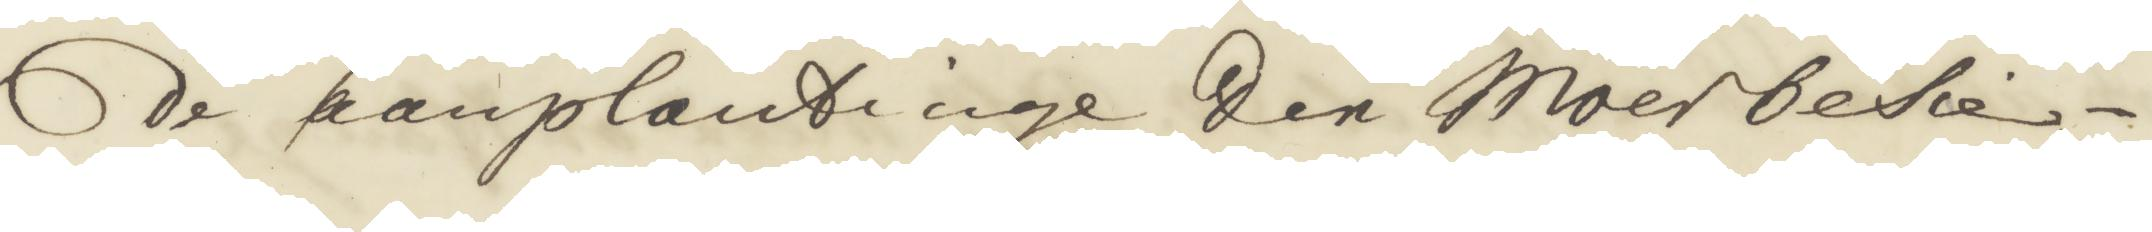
de aanplantinge der Moerbesie —
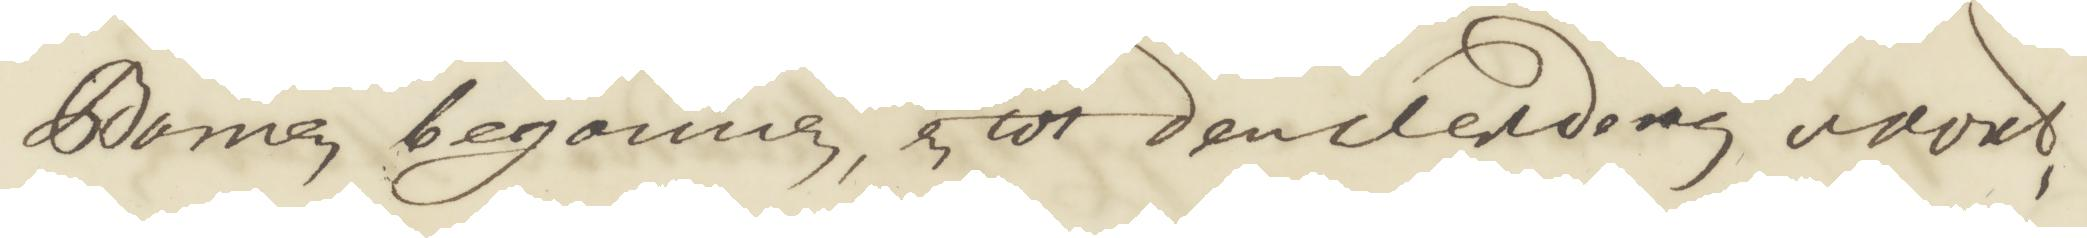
Bomen begonnen, en tot den verderen voort„
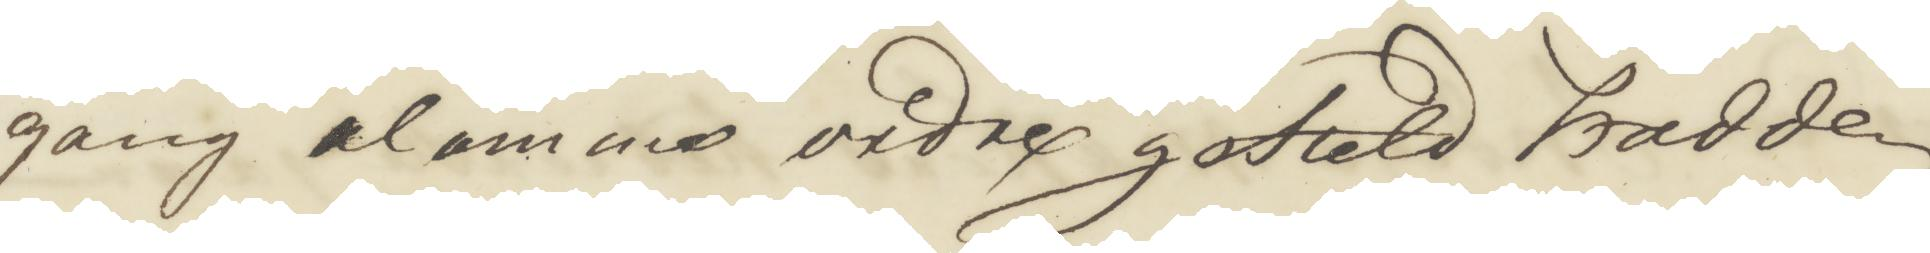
gang alomme ordre gesteld hadden
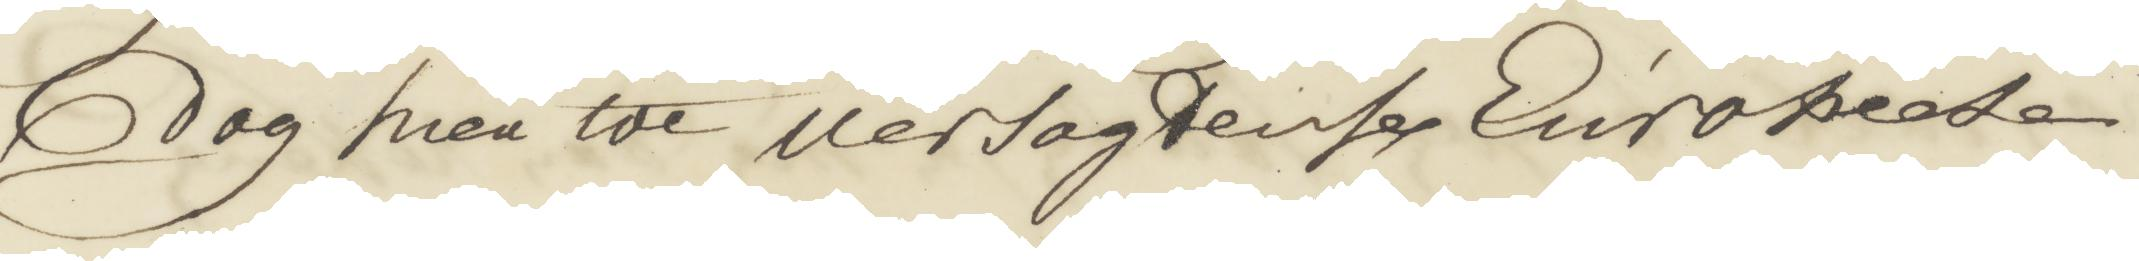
dog hier toe versogtense Europeese
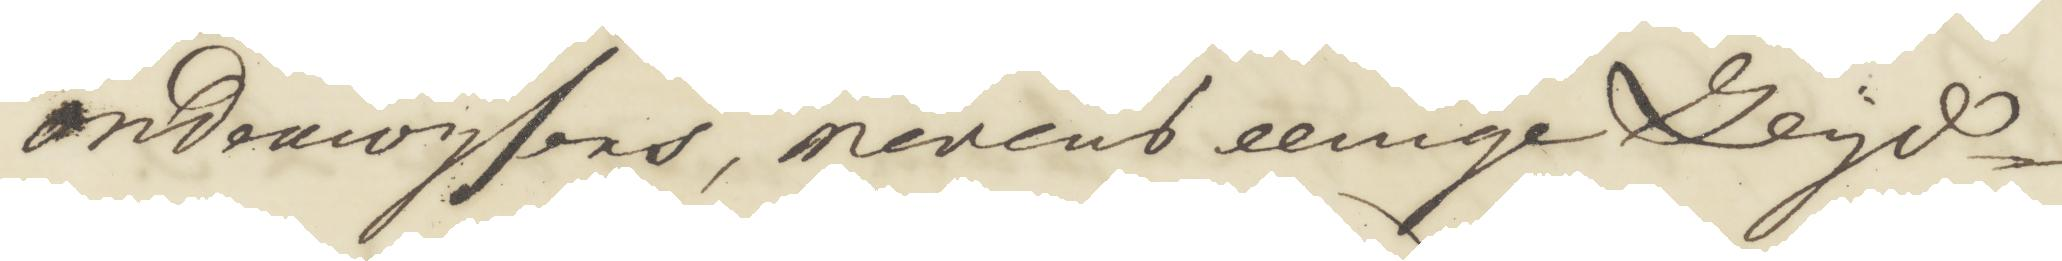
onderwysers, nevens eenige zeijd=
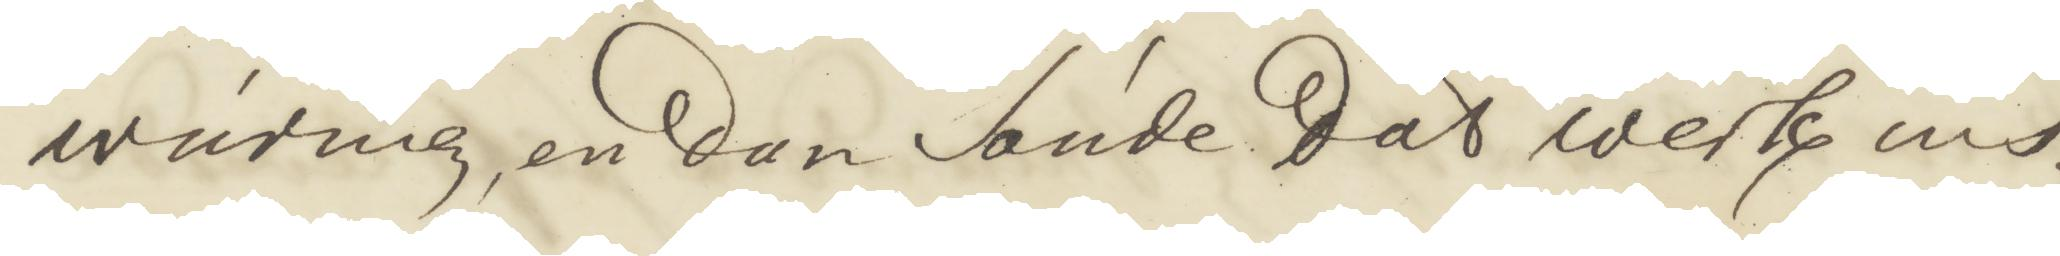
wurmen, en dan soude dat werk ins
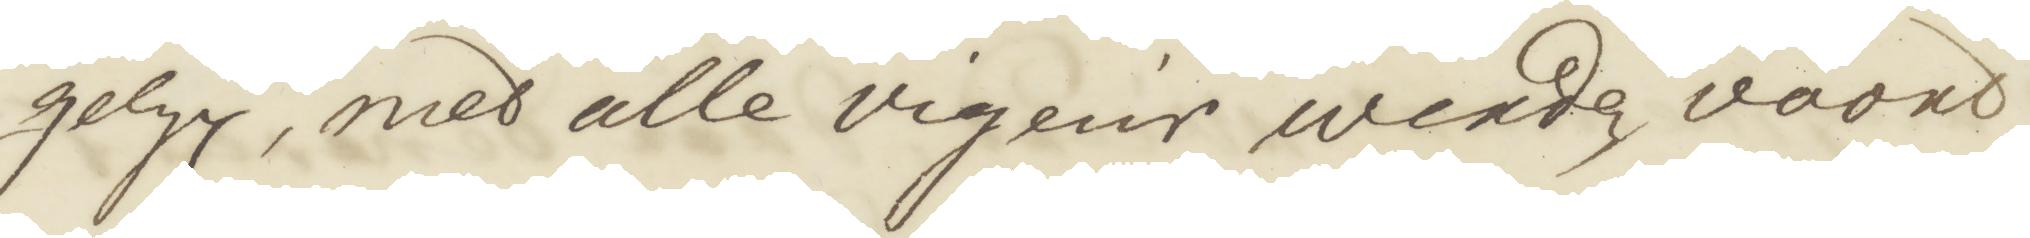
gelyx, met alle vigeur werden voort
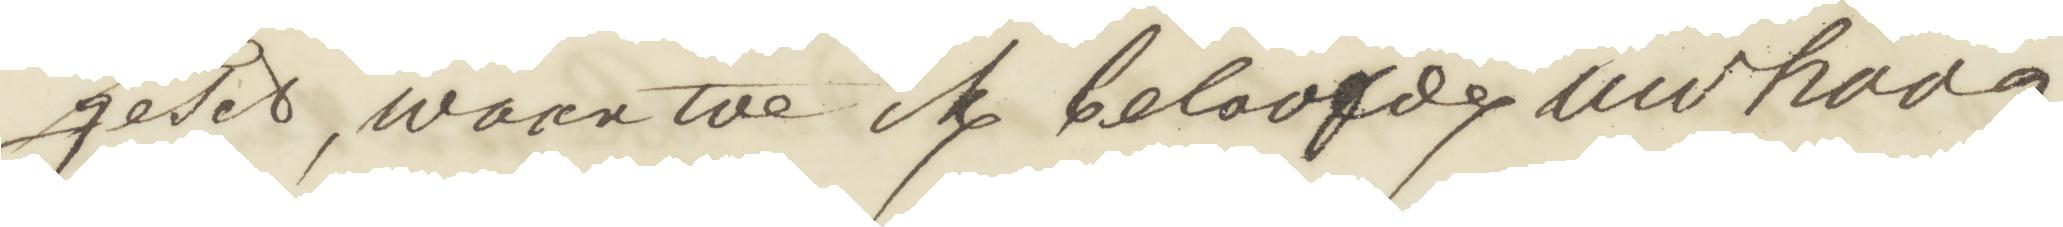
geset, waar toe ik beloofde uw hoog
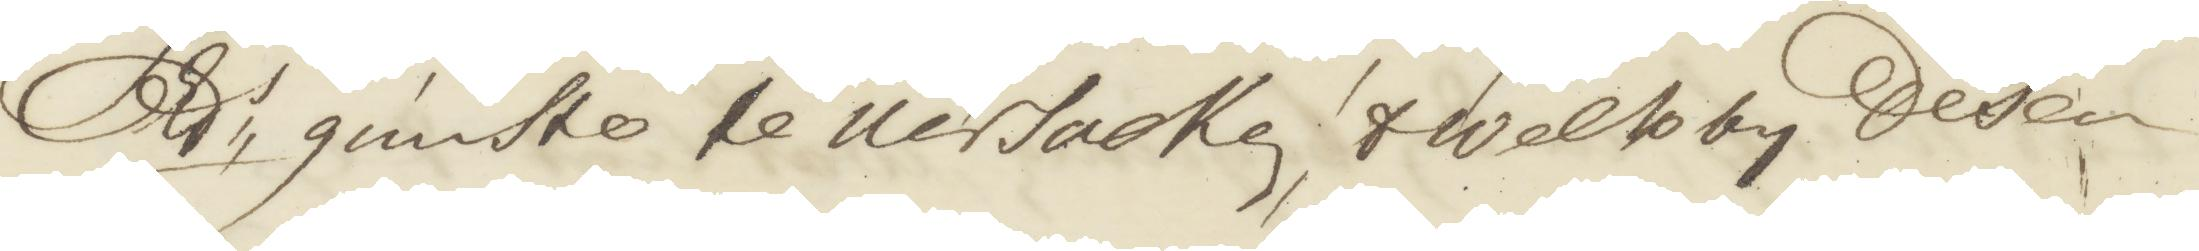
Ed„s gunste te versoeken, 't welk by desen
